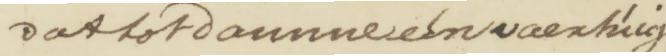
dat tot damme een vaertuig
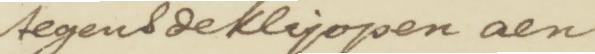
tegens de klippen aen
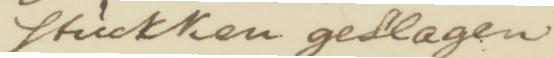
stuckken geslagen
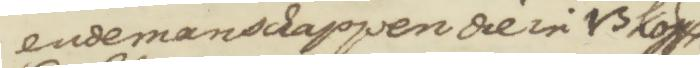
ende manschappen die in 13 kopp
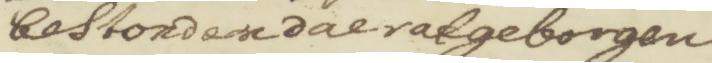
bestonden daer af geborgen
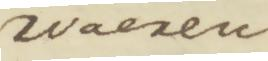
waeren
